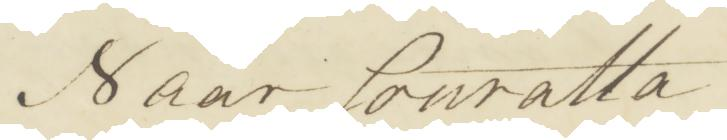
Naar Souratta
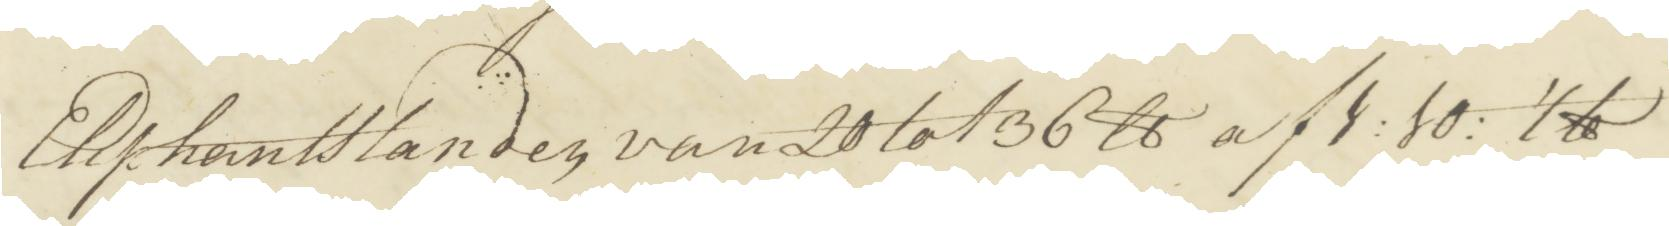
Eliphantstanden van 20 tot 36 lb a ƒ1:10: 't lb
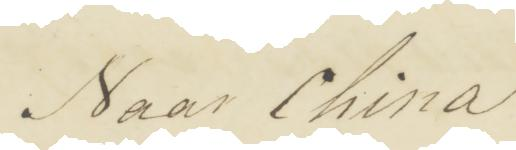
Naar China
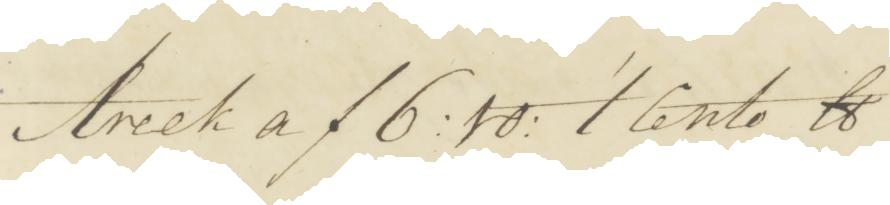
Areek a ƒ 6:10: ’t Cento lb
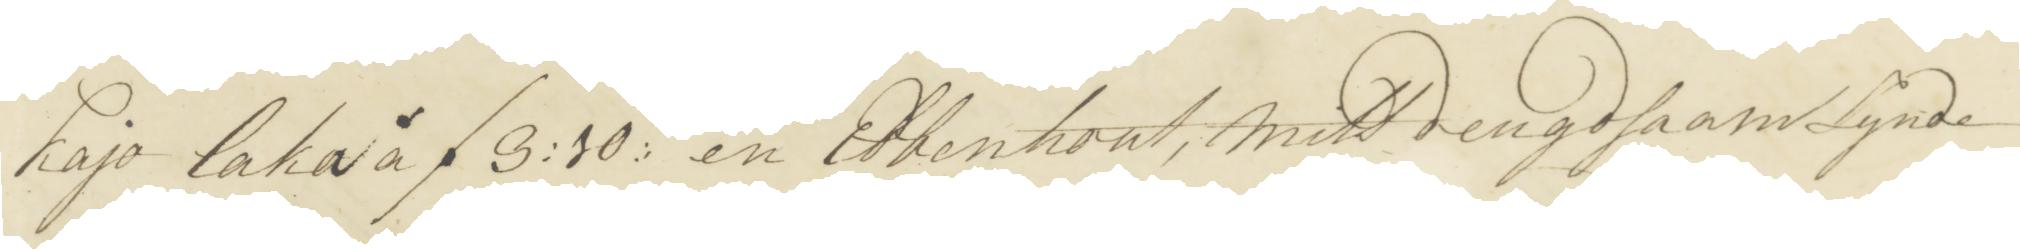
kajo laka à ƒ 3:10: en Ebbenhout, mits deugdsaam Zynde
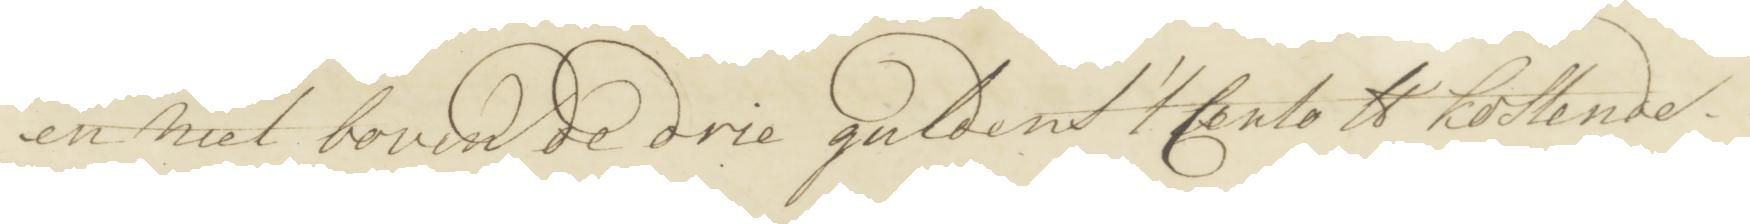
en niet boven de drie guldens ’t Cento lb kostende.
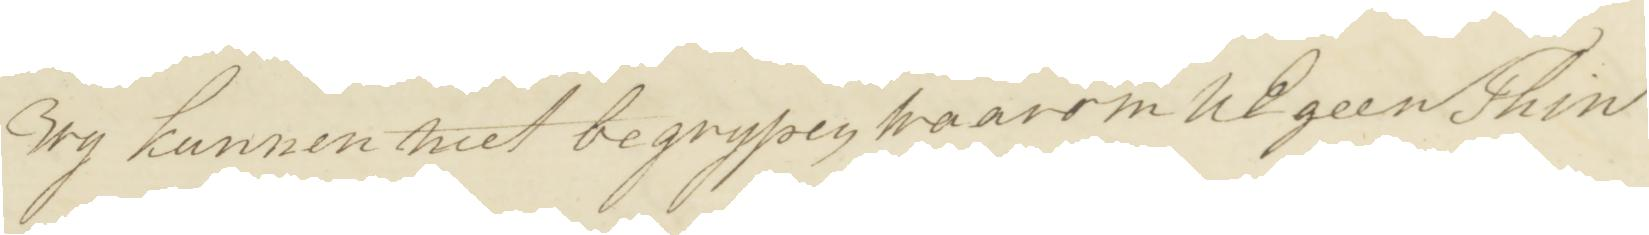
wy kunnen niet begrypen waarom UE geen Thin
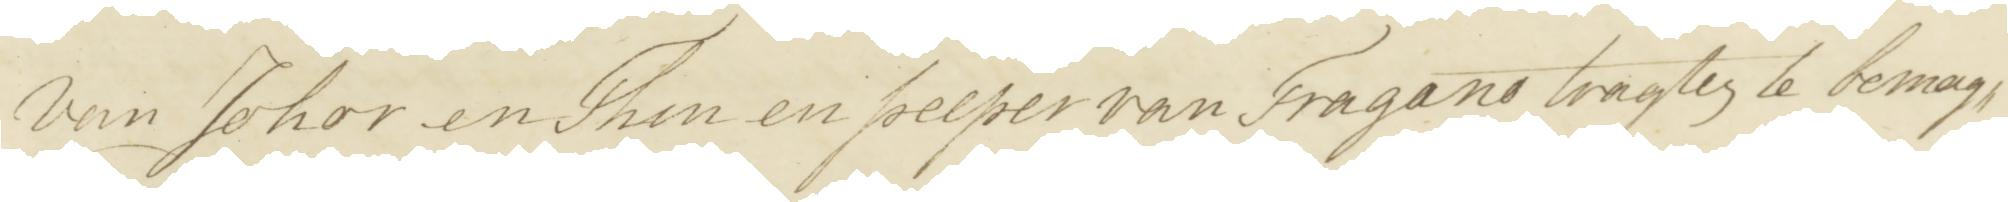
van Johor en Thin en peeper van Tragano tragten te bemag„
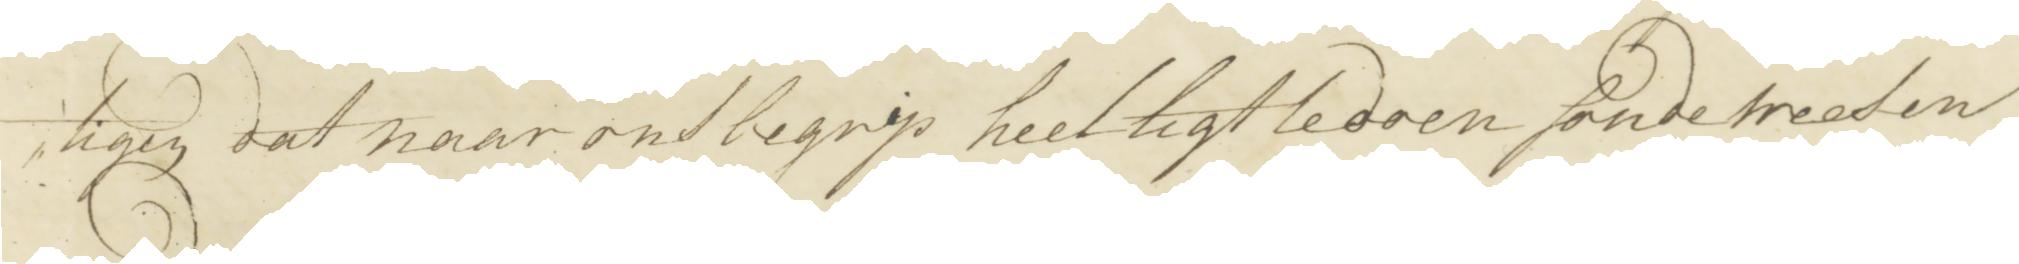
„tigen dat naar ons begrip heel ligt te doen soude weesen
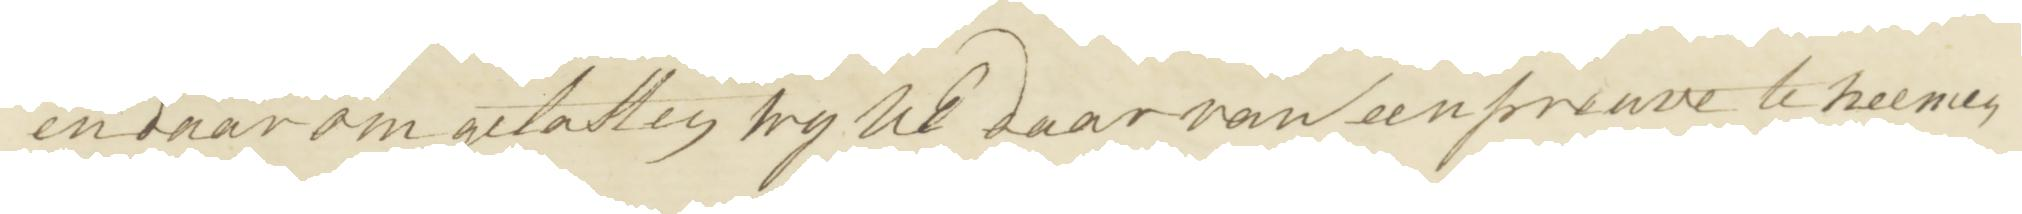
en daar om gelasten wy UE daar van een preuve te neemen
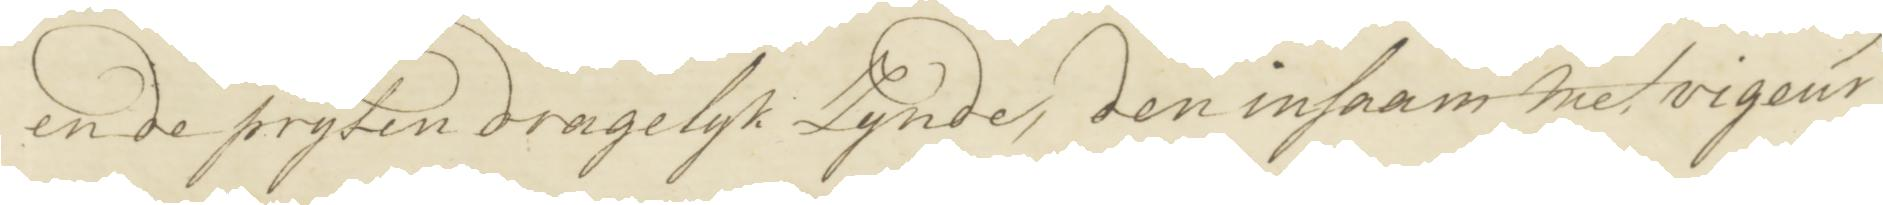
en de prysen dragelyk Zynde, den insaam met vigeur
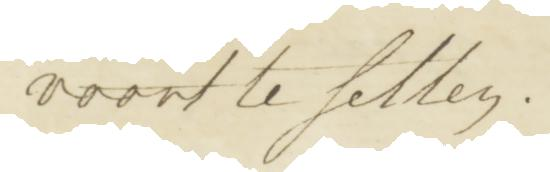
voort te setten.
